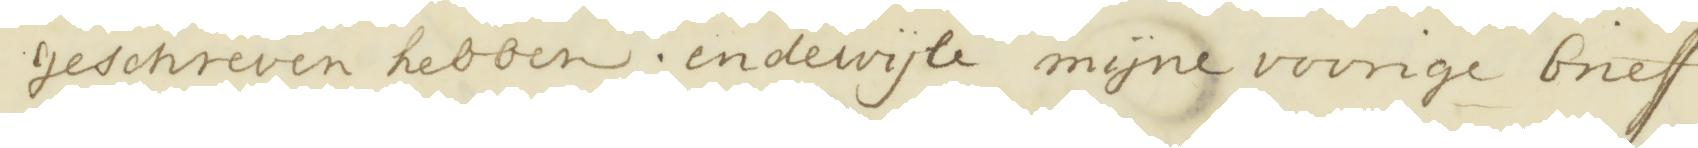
geschreven hebben. en dewijle mijne voorige brieff
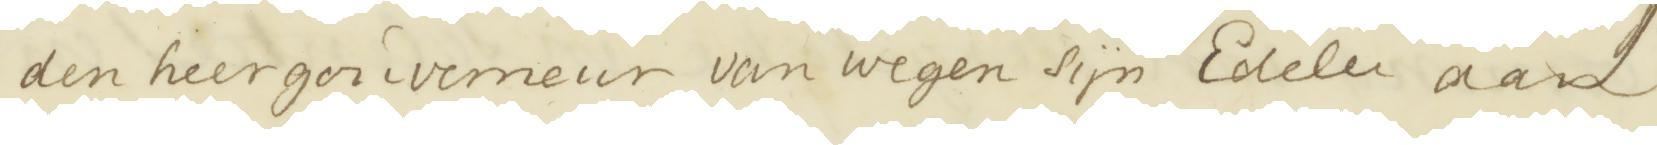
den heer gouverneur van wegen sijn Edele aan
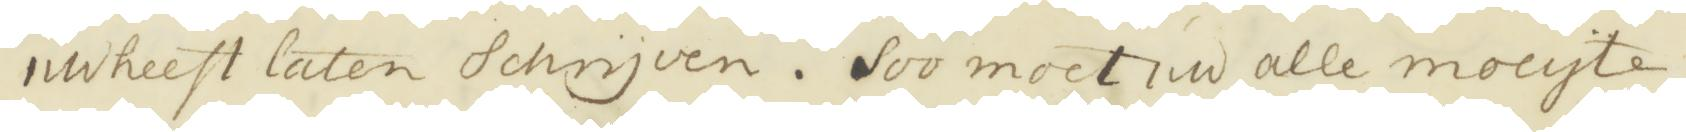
uw heeft laten schrijven. soo moet uw alle moeijte
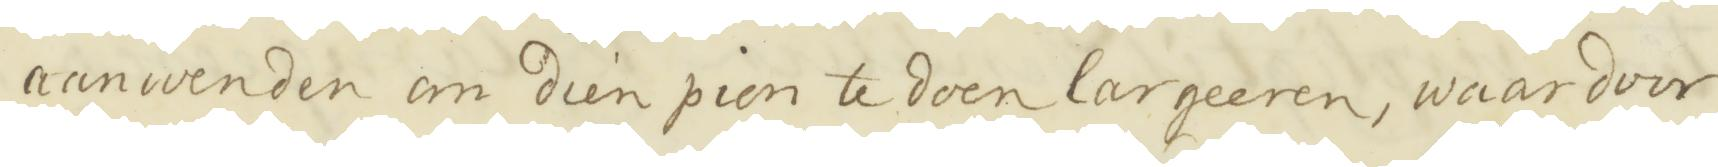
aanwenden om dien pion te doen largeeren, waar door
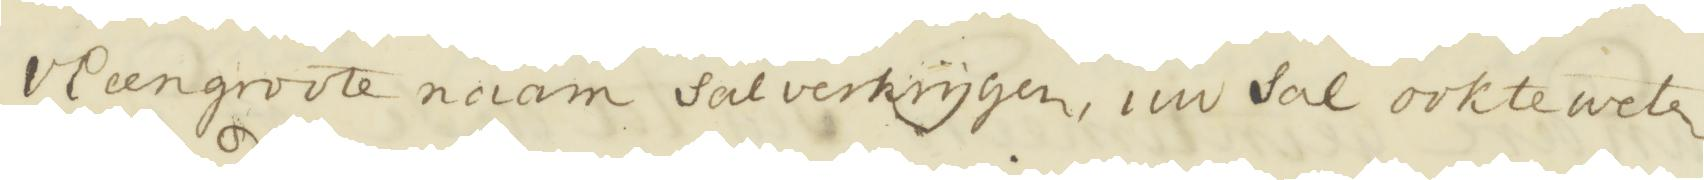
VE een groote naam sal verkrijgen, uw sal ook te weten
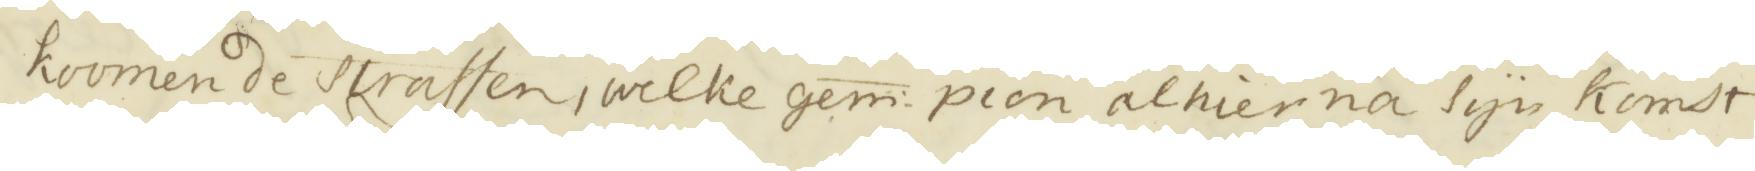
koomen de straffen, welke gem: pion alhier na sijn komst
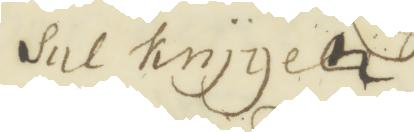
sal krijgen
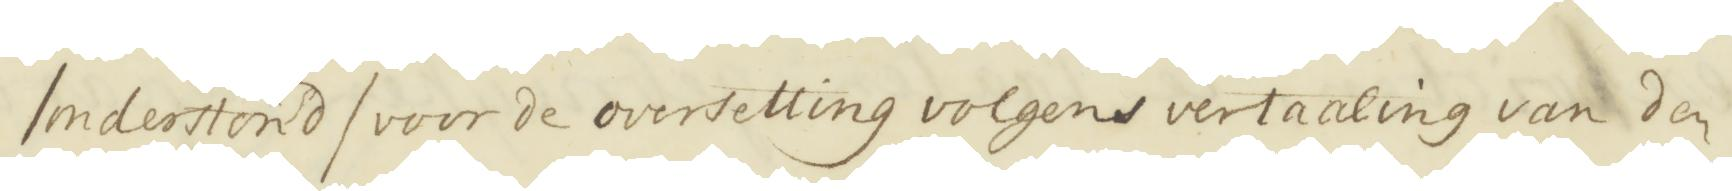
/onderstond/ voor de oversetting volgens vertaaling van den
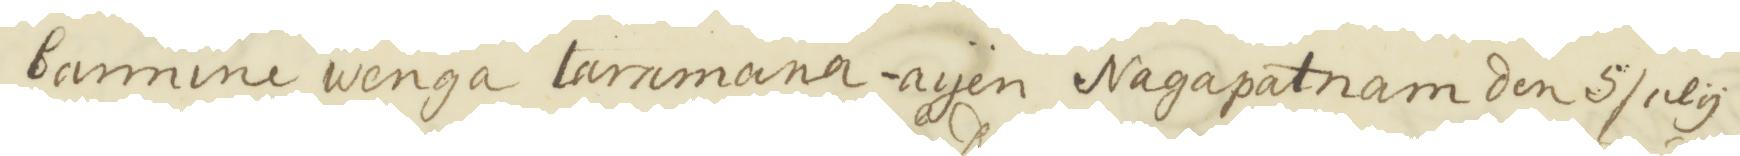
bannine wenga taramana-aijen Nagapatnam den 5 julij
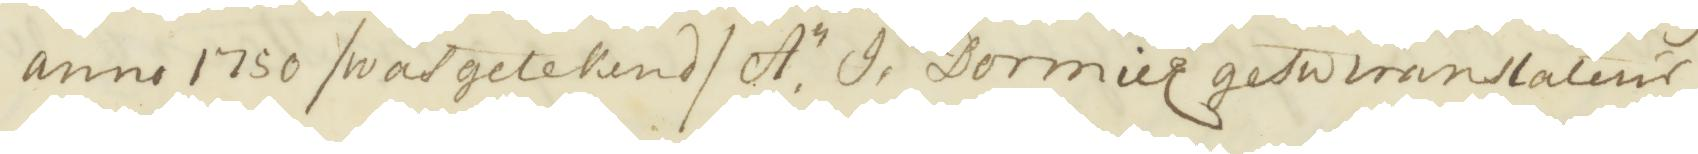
anno 1750 /was getekend/ A„r J„b Dormier gesw translateur
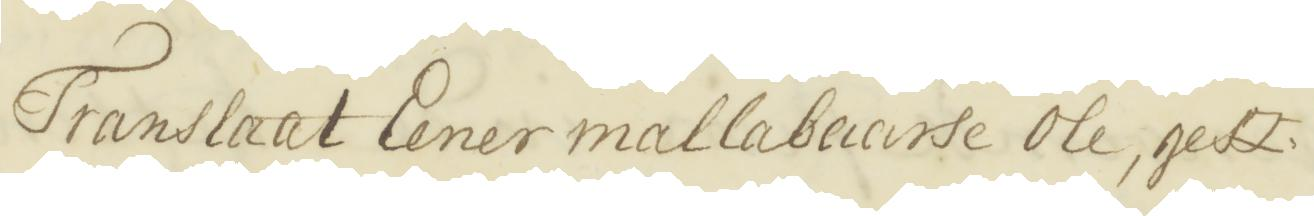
Translaat Eener mallabaarse ole, gesz:
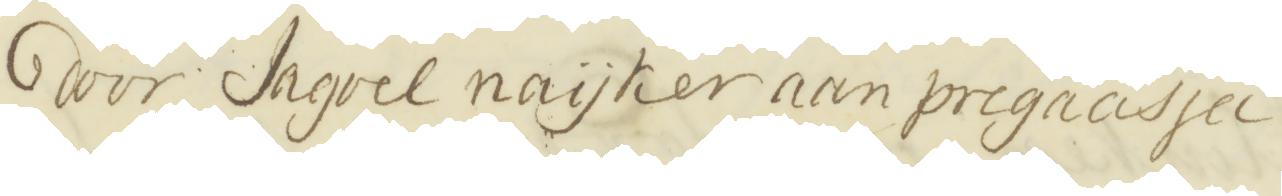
door Jagoel naijker aan pregaasja
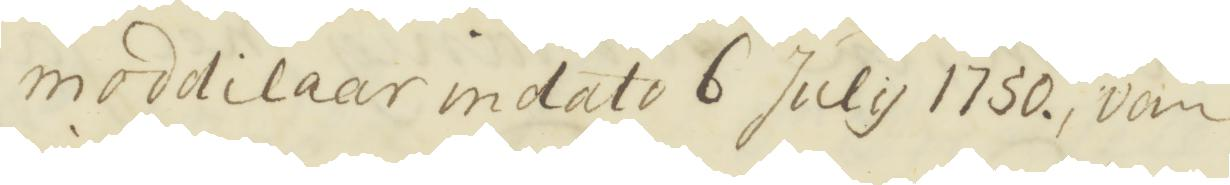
moddilaar in dato 6 Julij 1750., van
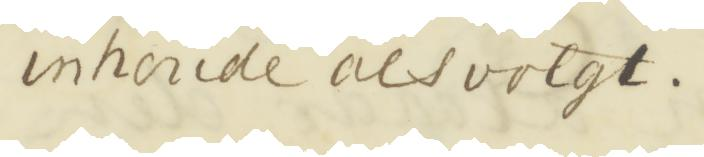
inhoude als volgt.
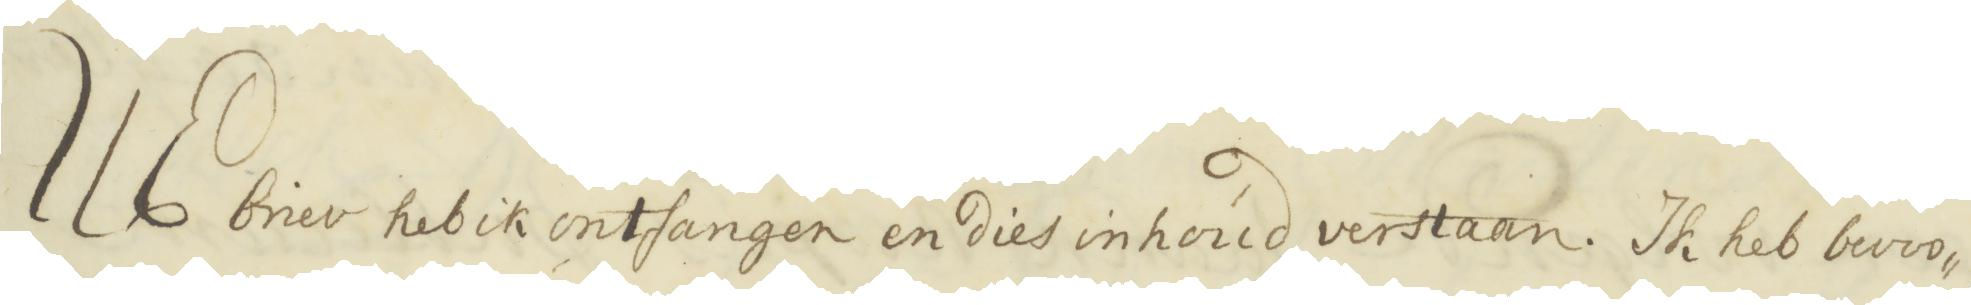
UE briev heb ik ontfangen en dies inhoud verstaan. Ik heb bevoo„
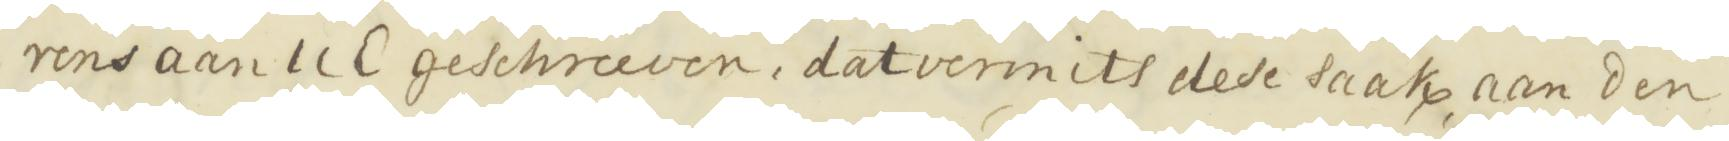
rens aan uE geschreeven, dat vermits dese saak aan den
